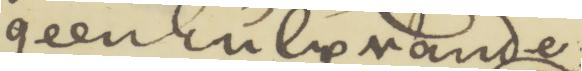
geen hulp van de
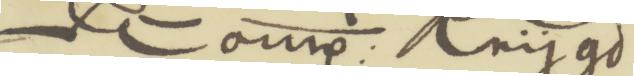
EComp: krijgd
